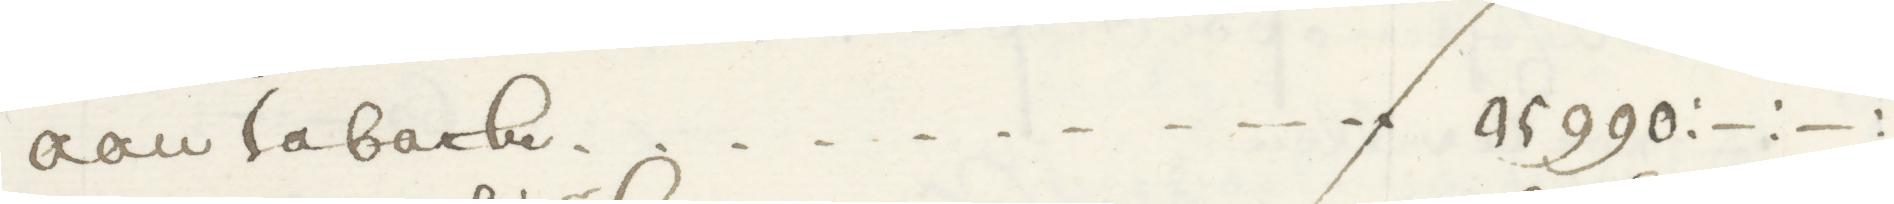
aan taback - - - - - - - - - - -ƒ 45990: —: —:
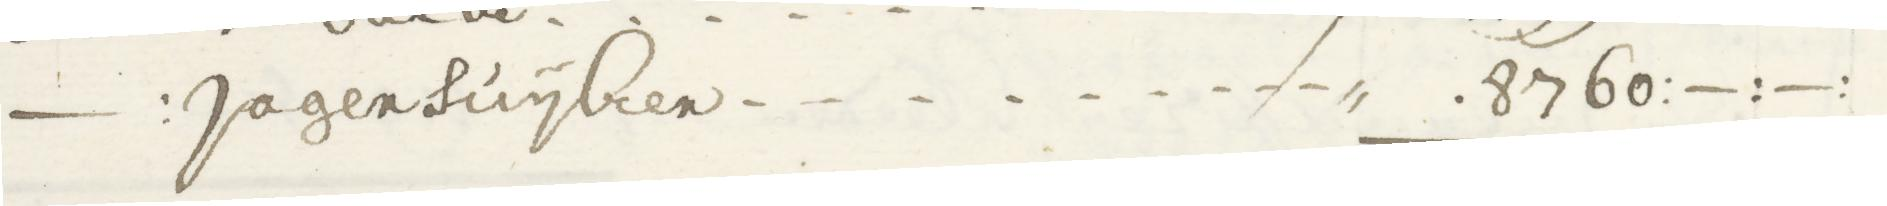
—: Jager Suijker - - - - - - - - -„ . 8760: —: —:
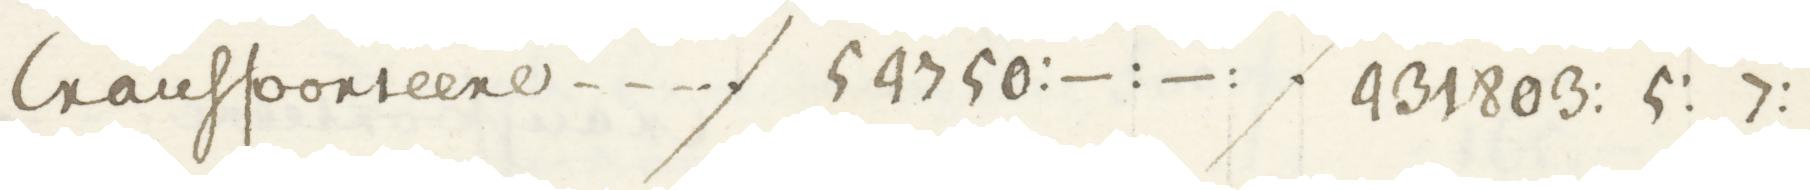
transporteere- - - - . ƒ 54750: —: —: ƒ 431803: 5: 7:
